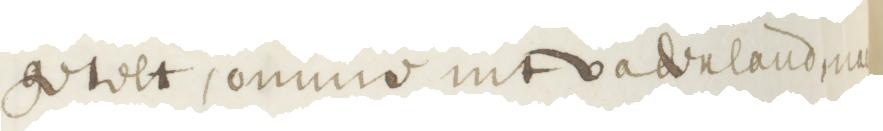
getelt, omme int vaderland, na
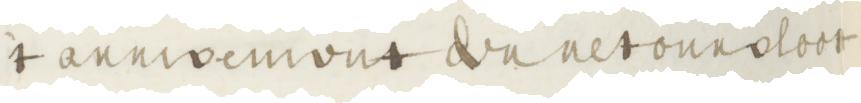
’t arrivement den retour vloot
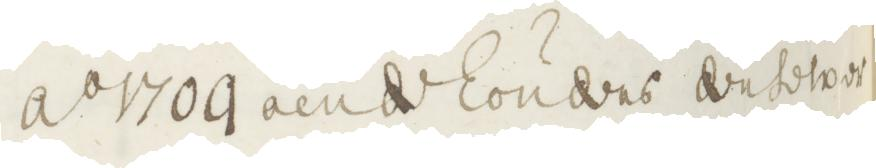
a.o 1704 aen de houders deselver
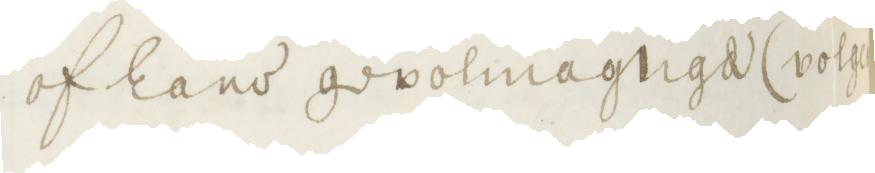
of hare gevolmagtigde (volg
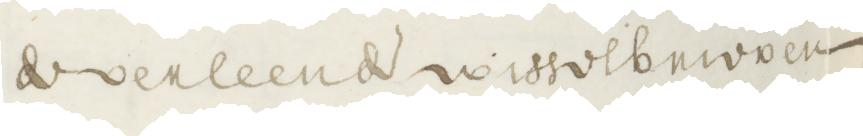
de verleende wisselbrieven
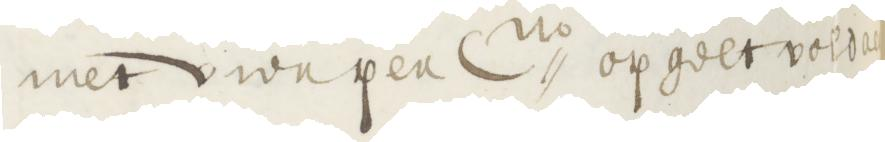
met vier per C„no op gelt volda
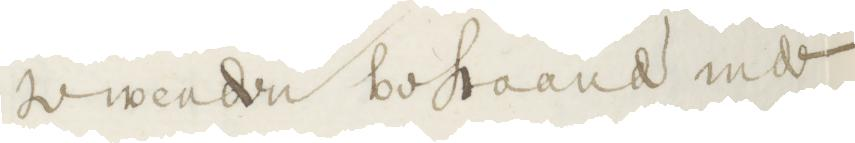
te werden bestaande inde
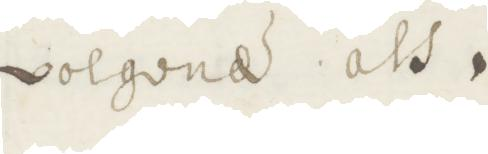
volgende als.
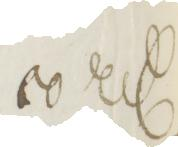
50 RE
